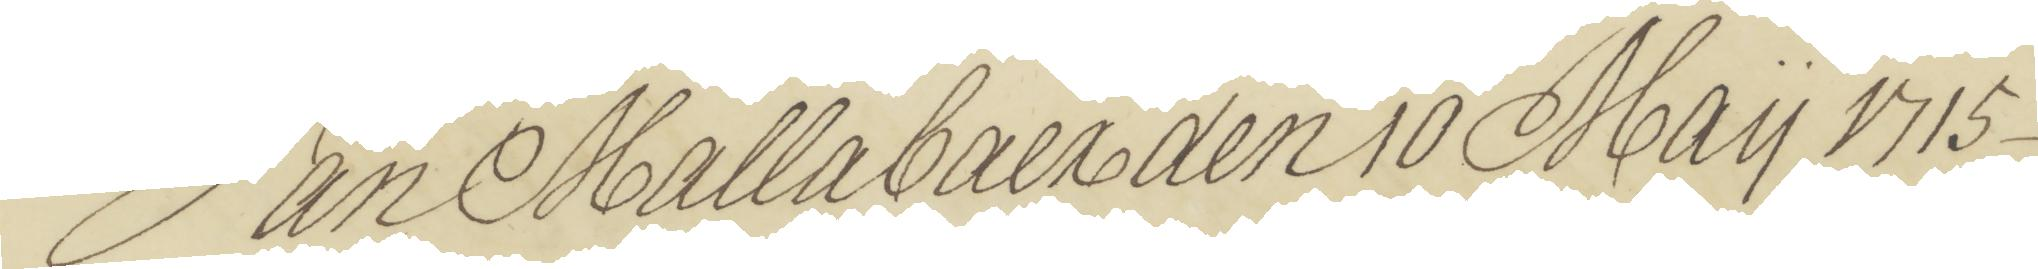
Van Mallabaer den 10 Maij 1715
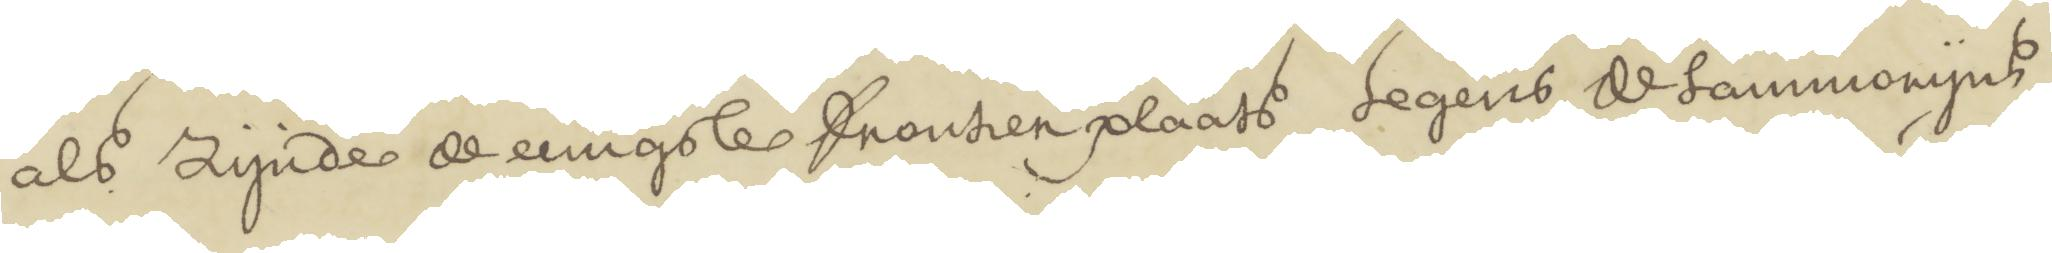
als zijnde de eenigste frontier plaats tegens de sammorijns
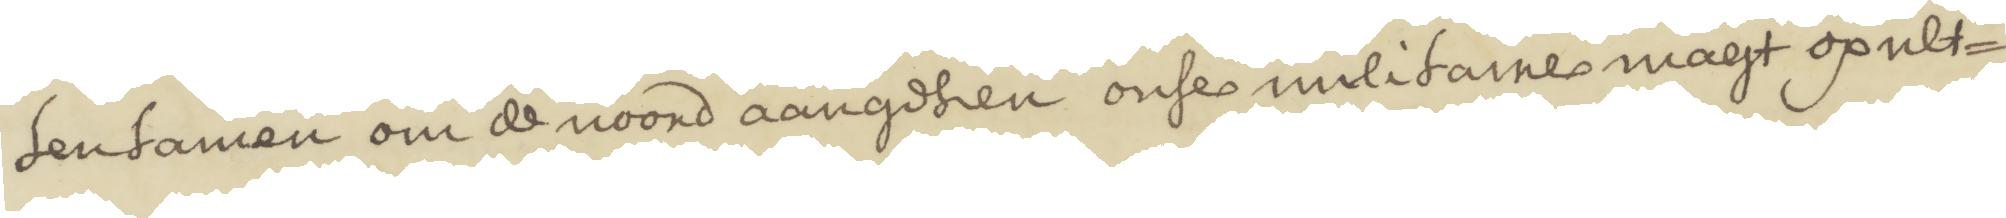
tentamen om de noord aangesien onse militaire magt op ult=mo
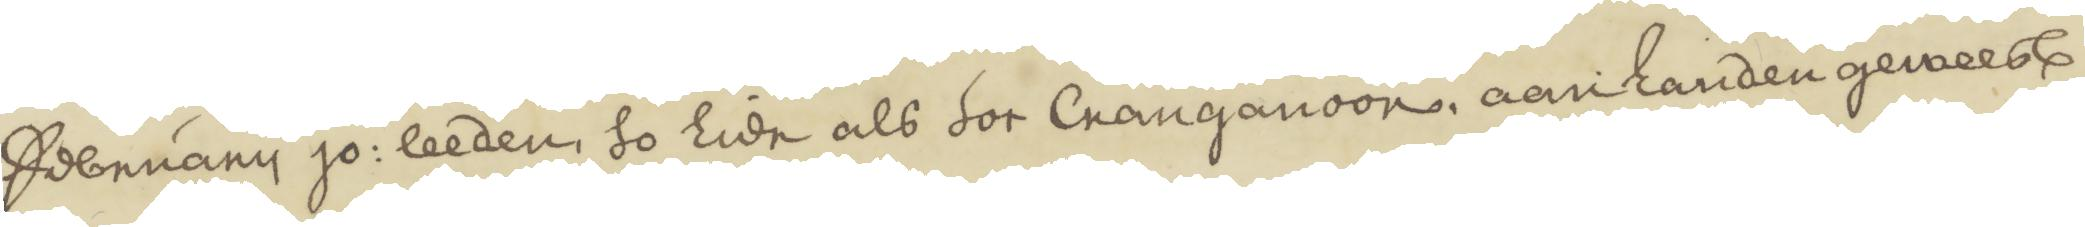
februarij jo: leeden, so hier als tot Cranganoor, aan handen geweest
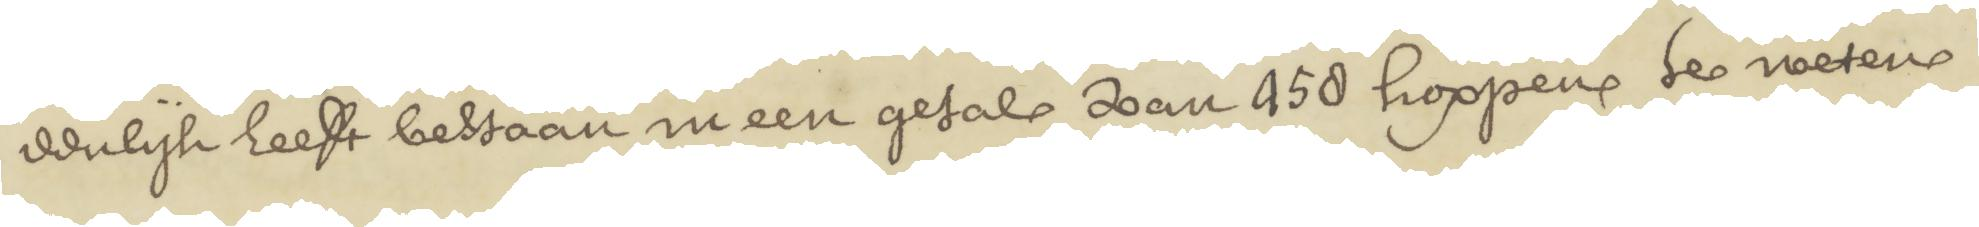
eenlijk heeft bestaan in een getal van 458 koppen te weten
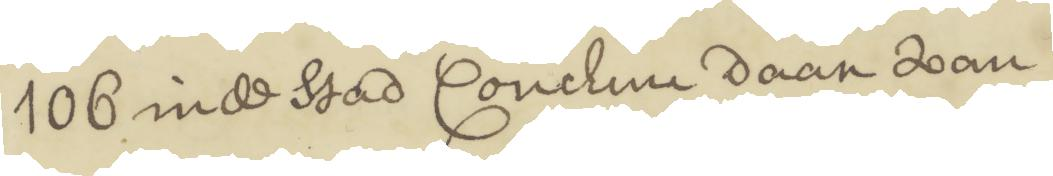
106 in de stad Couchim daar van
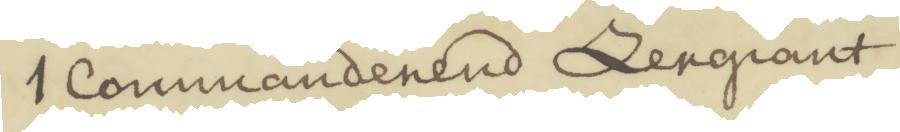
1 Commanderend Zergiant
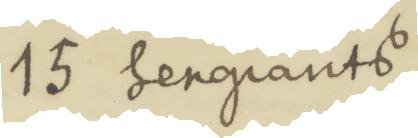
15 Sergiants
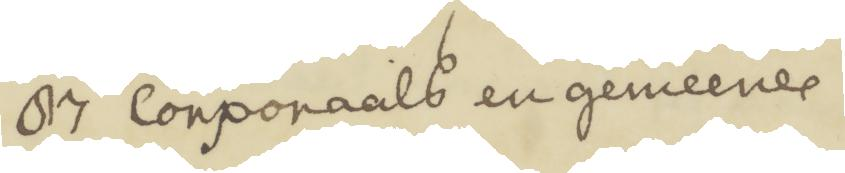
87 Corporaals en gemeene
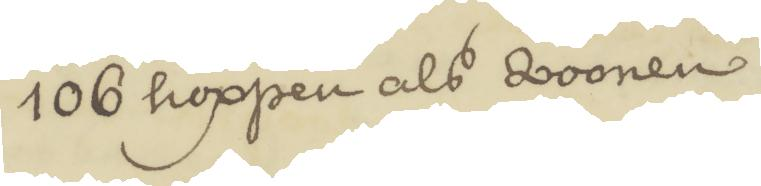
106 koppen als vooren
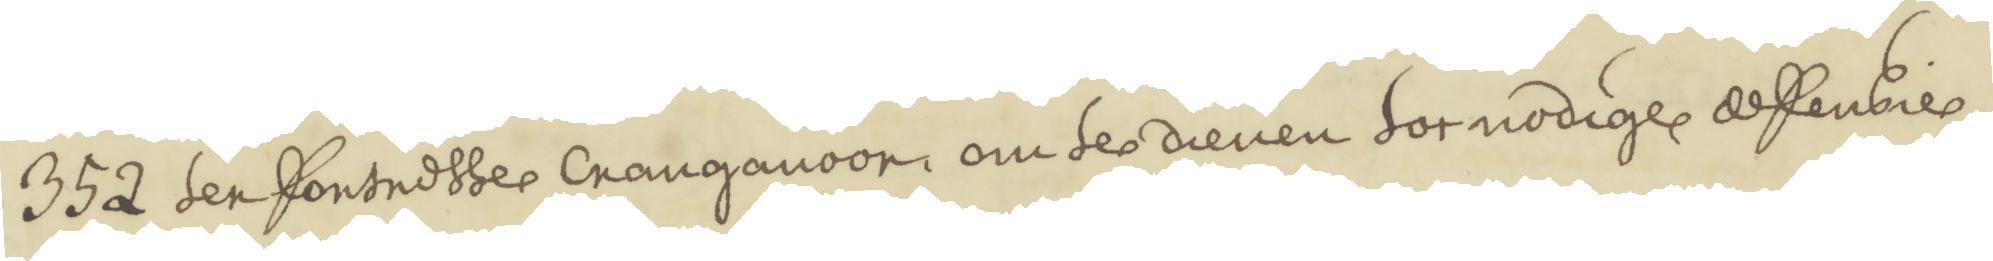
352 ter fortresse Cranganoor, om te dienen tot nodige defensie
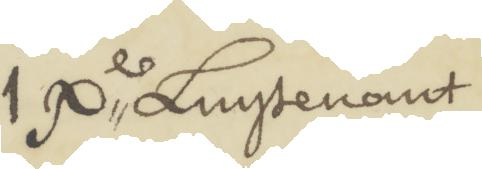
1. p„e Luytenant
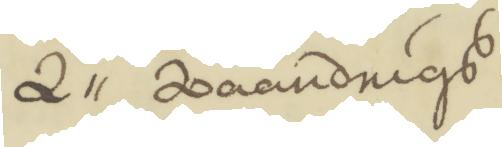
2„ vaandrigs
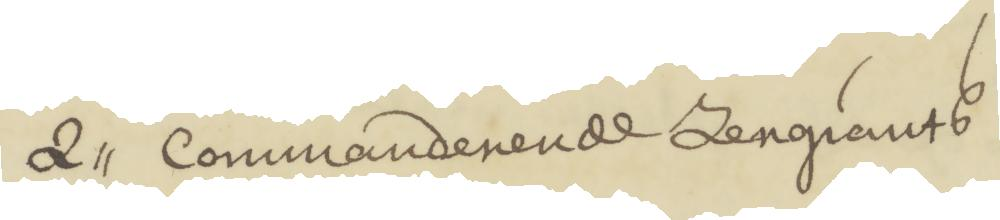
2„ Commanderende zergiants
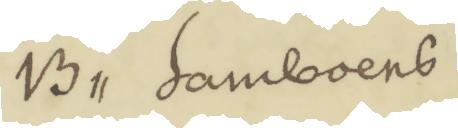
13„ tamboers
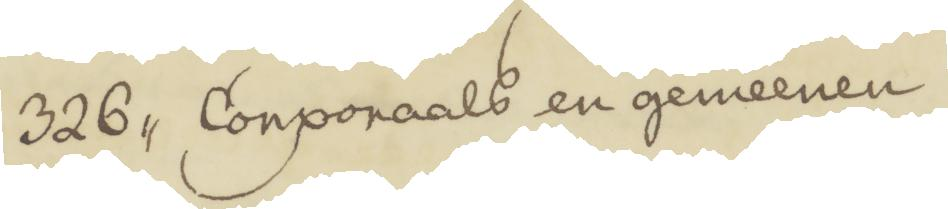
326„ Corporaals en gemeenen
